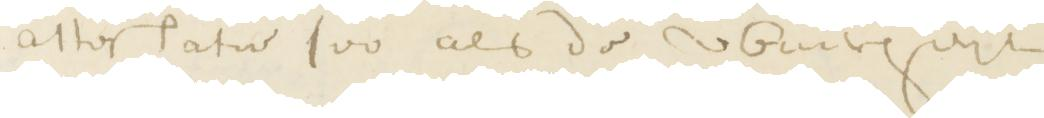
attestatie soo als de waerheyt
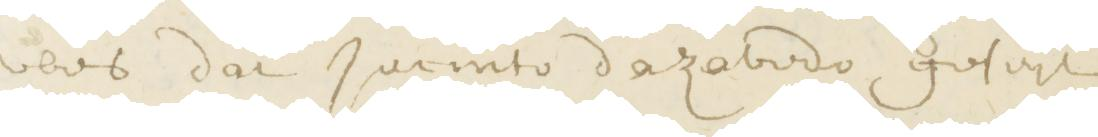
wes dat Jacinto d'azavedo geseyt
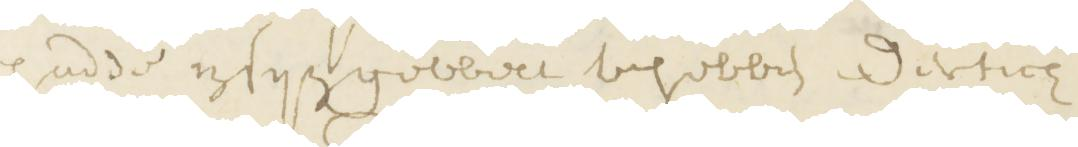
hadde in syn gewelt te hebben Dertich
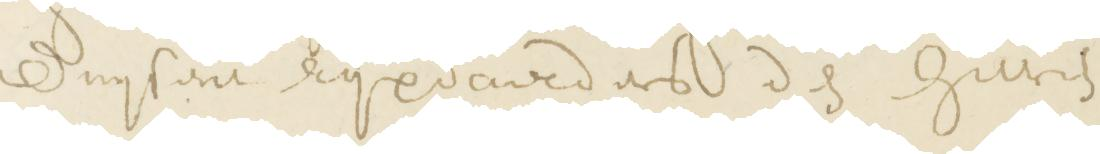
Duysent ryxdaelders den heeren
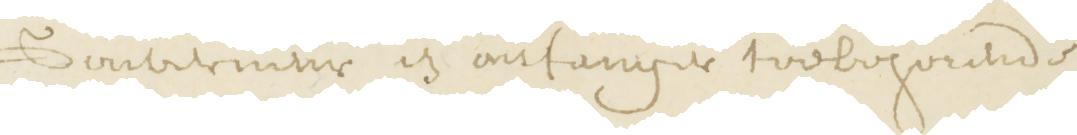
Gouverneur en ontfanger toebehorende
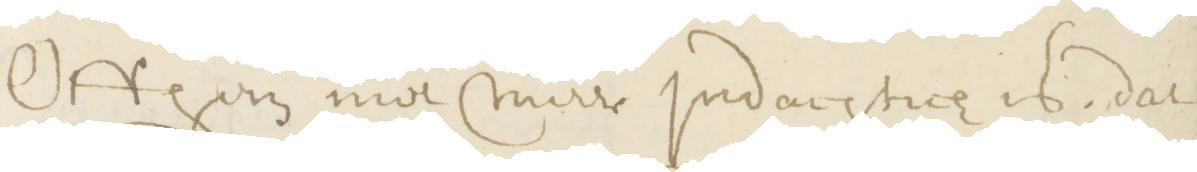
Oft hem niet meer Jndagtich is, dat
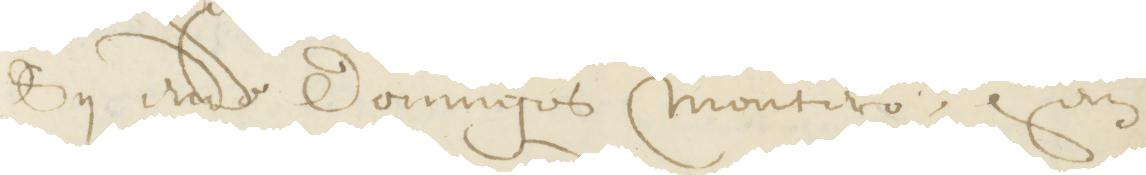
sy ende Domingos montero, hem
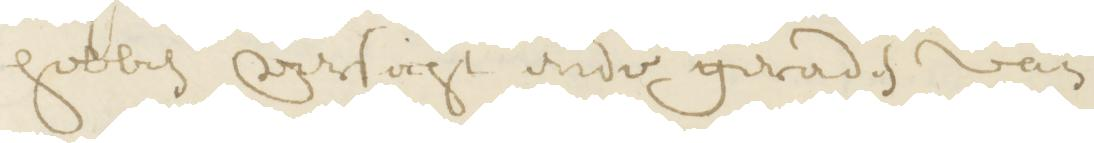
hebben versogt ende geraden van
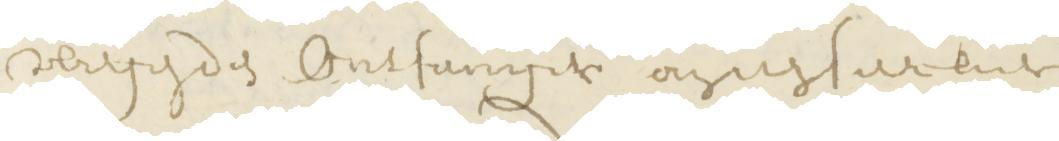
wegen den Ontfanger om een seecker
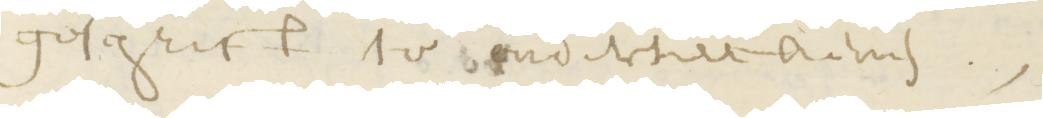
geschrift te onderteeckenen.,
